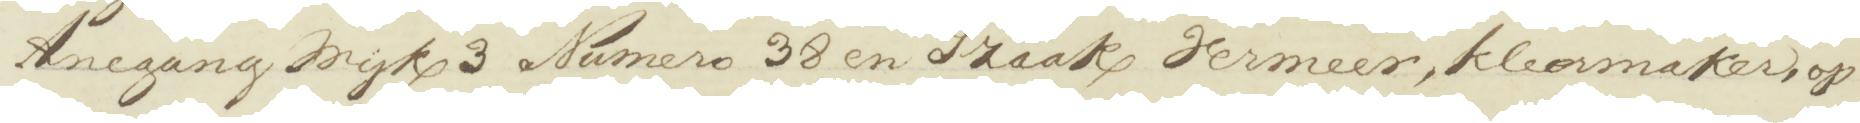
Anegang Wijk 3 Numero 38 en Izaak Vermeer, kleermaker, op
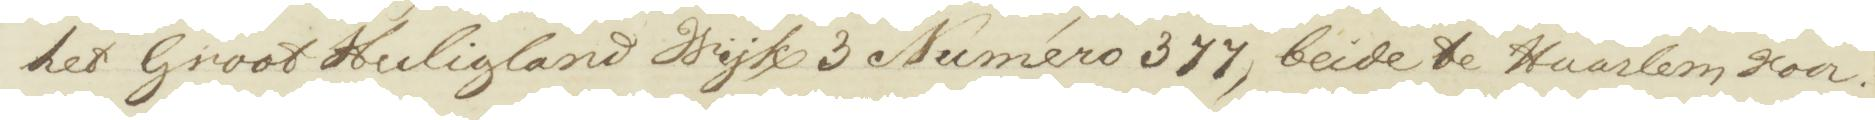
het Groot Heiligland Wijk 3 Numero 377, beide te Haarlem voor.
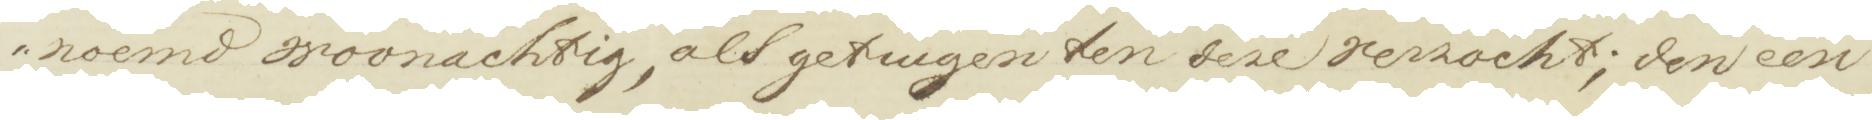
„noemd woonachtig, als getuigen ten deze verzocht; den een
